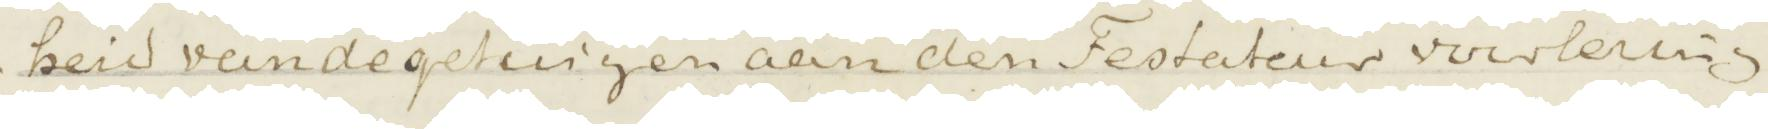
„heid van de getuigen aan den Testateur voorlezing
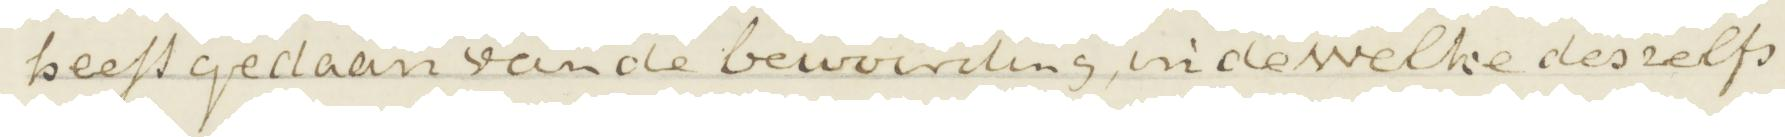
heeft gedaan van de bewoording, in de welke deszelfs
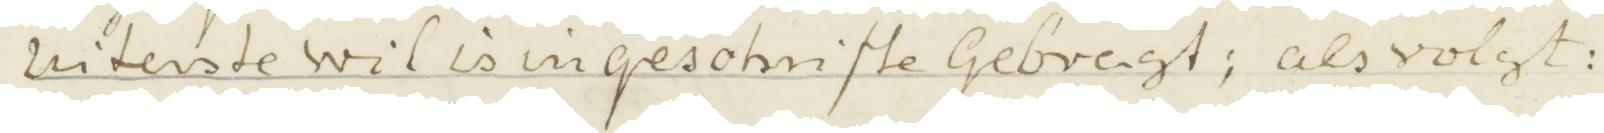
uiterste wil is in geschrifte Gebragt; als volgt:
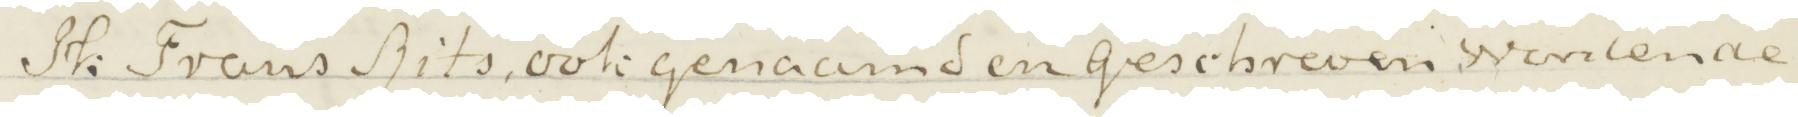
Ik Frans Rits, ook genaamd en geschreven wordende
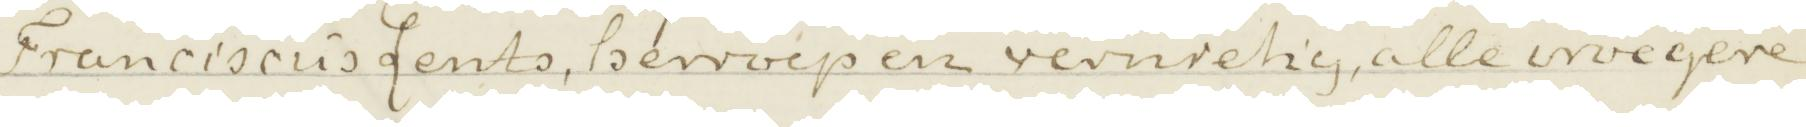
Franciscus Lents, herroep en vernietig, alle vroegere
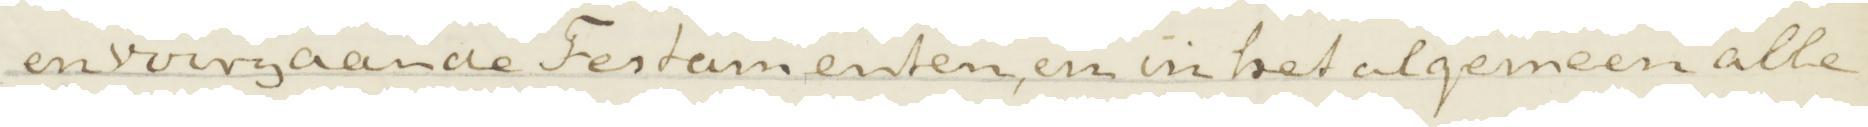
en voorgaande Testamenten, en in het algemeen alle
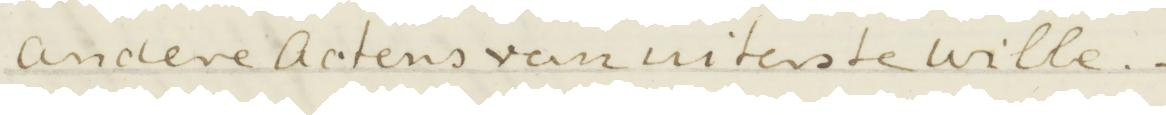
andere Actens van uiterste Wille.
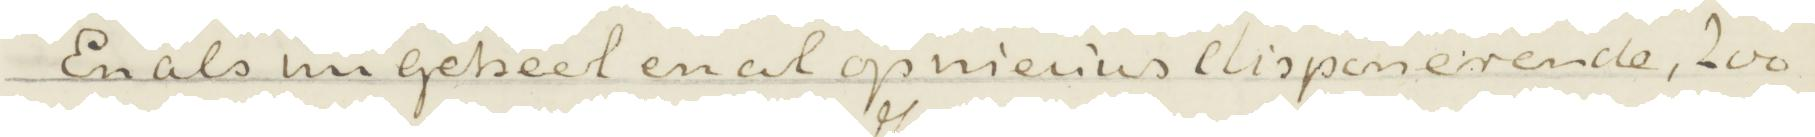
En als nu geheel en al opnieuw disponerende, Zoo
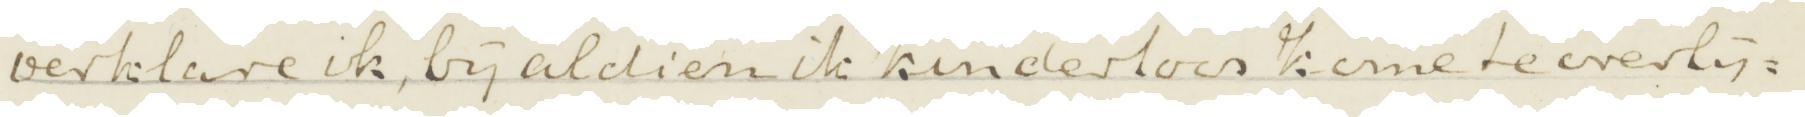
verklare ik, bij aldien ik kinderloos kome te overlij=
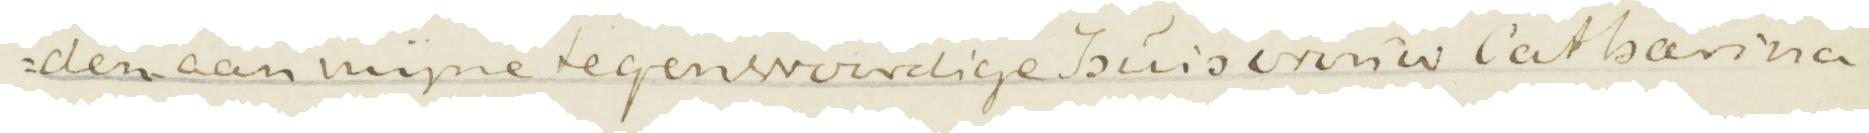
=den aan mijne tegenwoordige huisvrouw Catharina
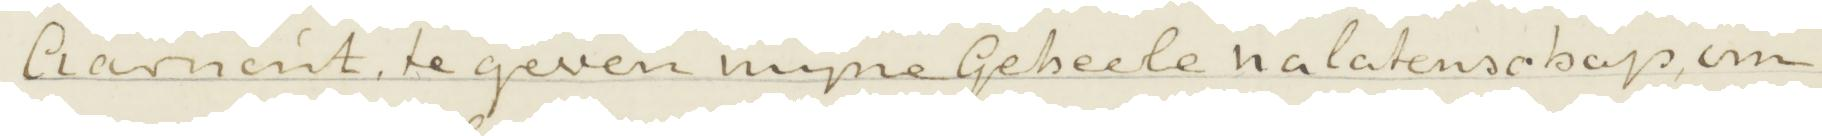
Aarnout, te geven mijne Geheele nalatenschap, om
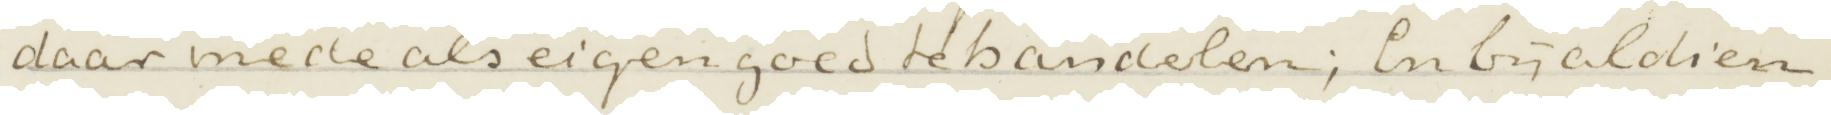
daarmede als eigen goed te handelen; En bij aldien
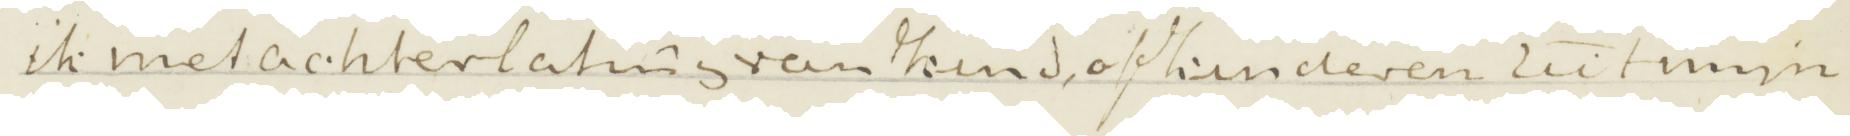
ik met achterlating van kind, of kinderen uit mijn
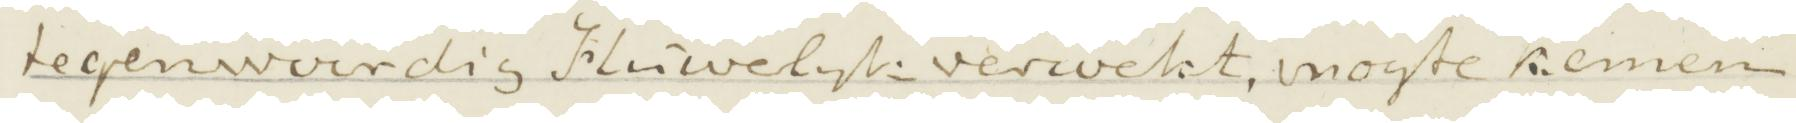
tegenwoordig Huwelyk verwekt mogte komen
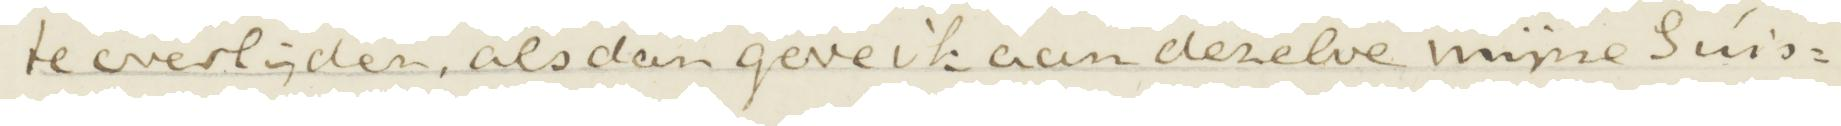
te overlijden, als dan geve ik aan dezelve mijne huis=
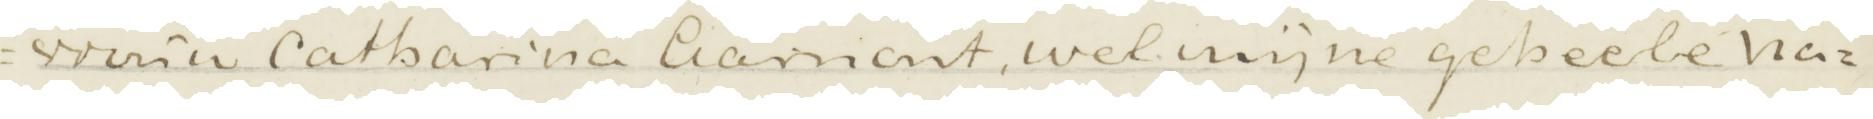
=vrouw Catharina Aarnout, wel mijne geheele na=
